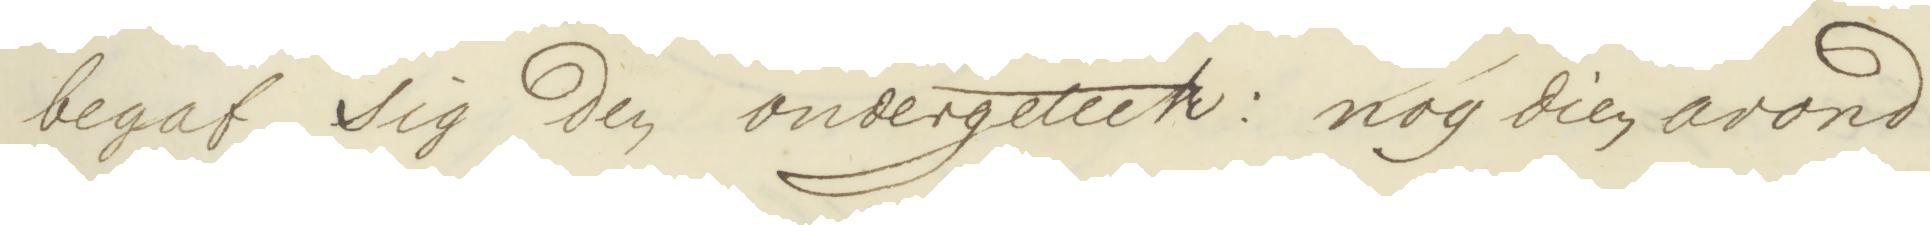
begaf sig den ondergeteek: nog dien avond
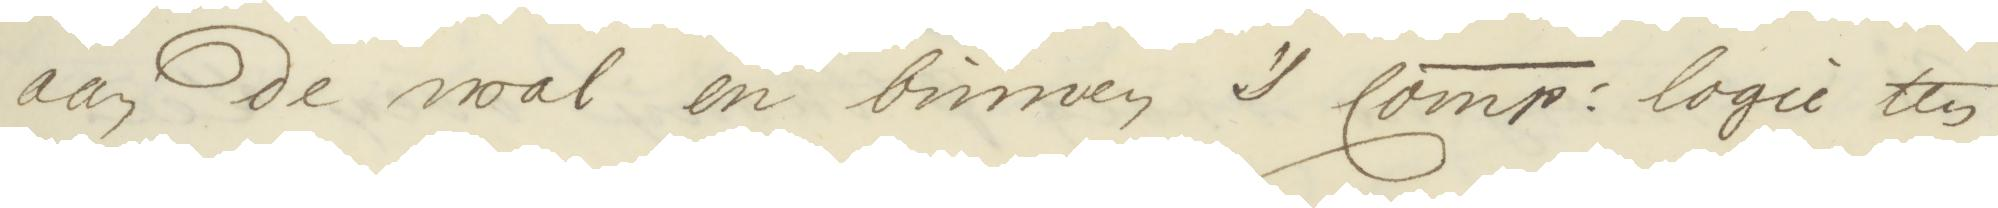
aan de wal en binnen ’s Comp: logie ten
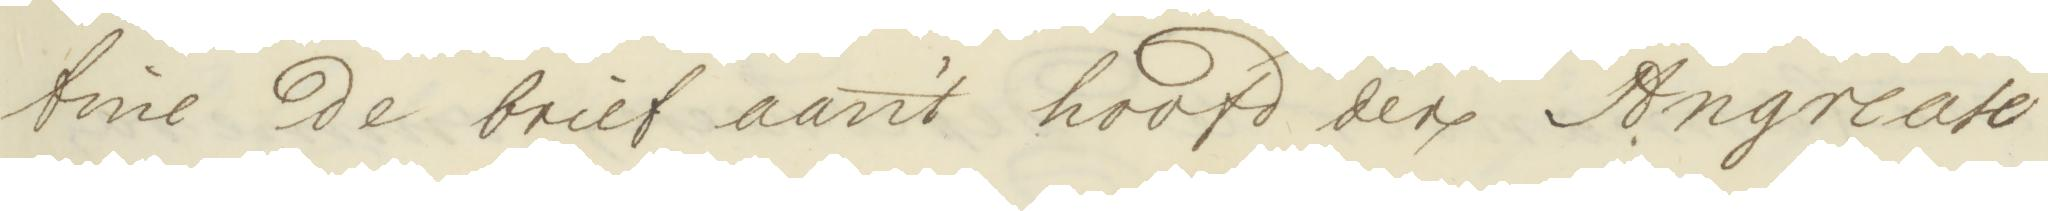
fine de brief aan't hoofd der Angreate
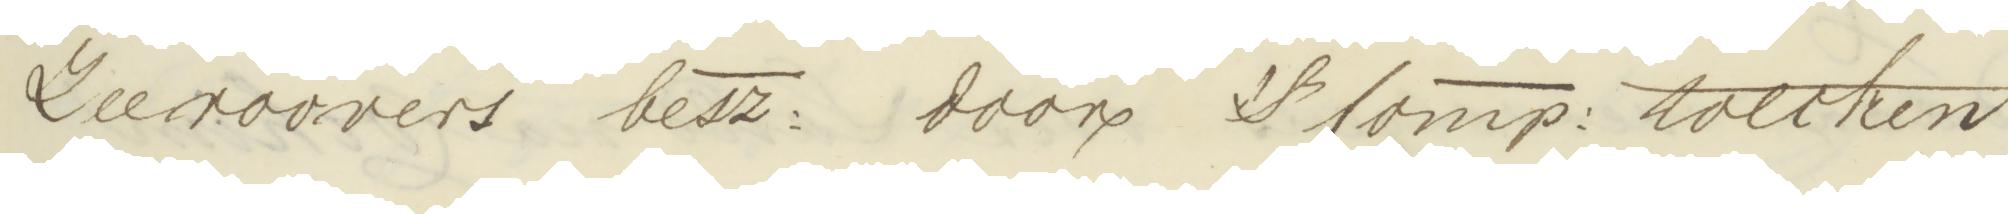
Zeeroovers besz: door ’s Comp: toecken
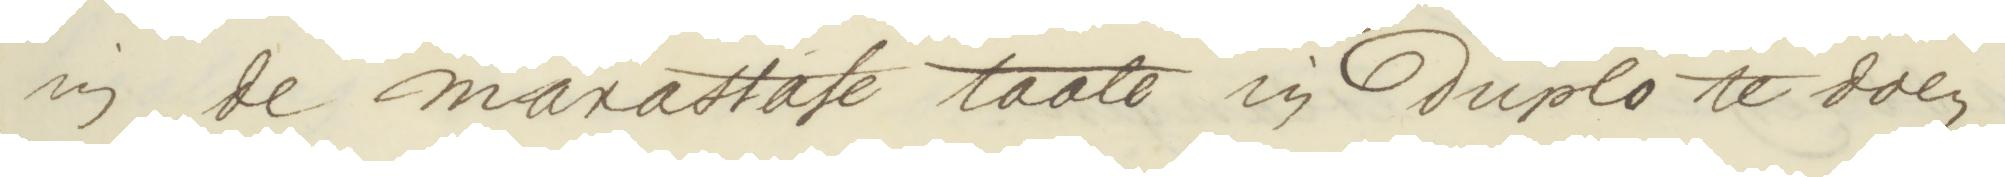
in de marattase taale in duplo te doen
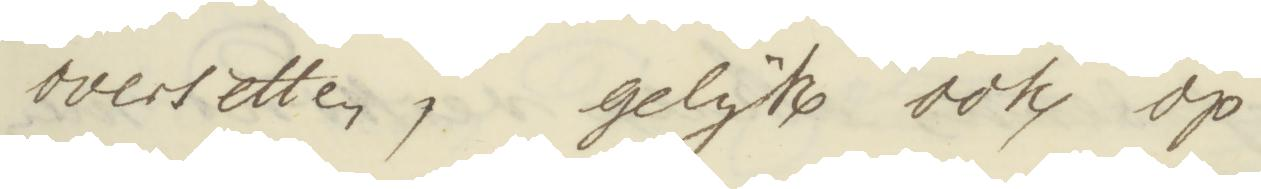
oversetten, gelijk ook op
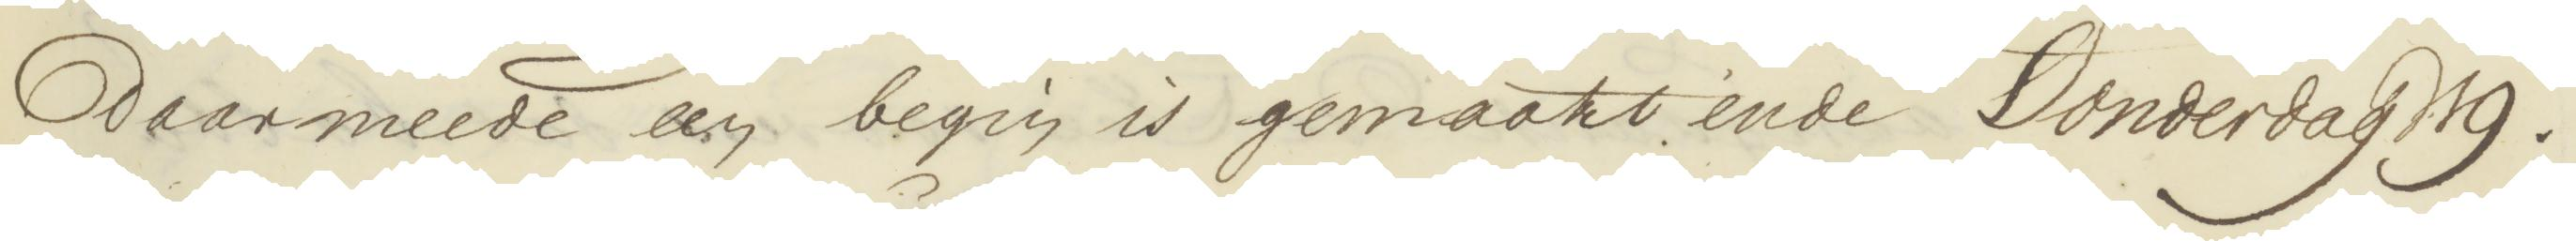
daarmeede een begin is gemaakt ende Donderdag 19.
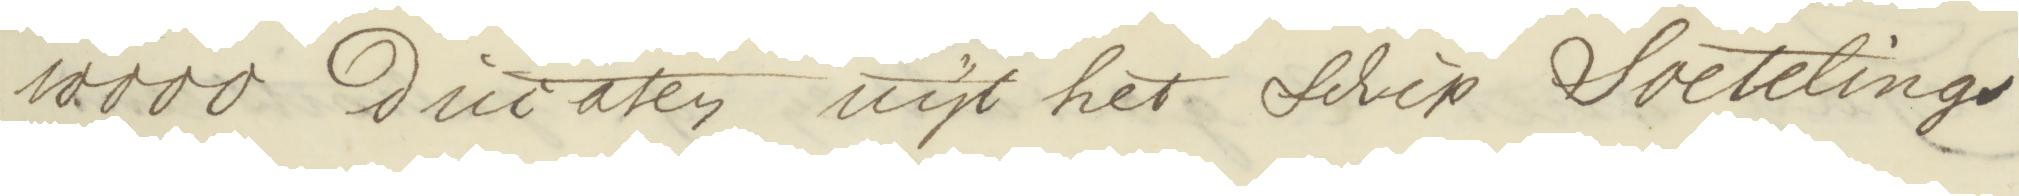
10000 ducaten uijt het schip Soetelings
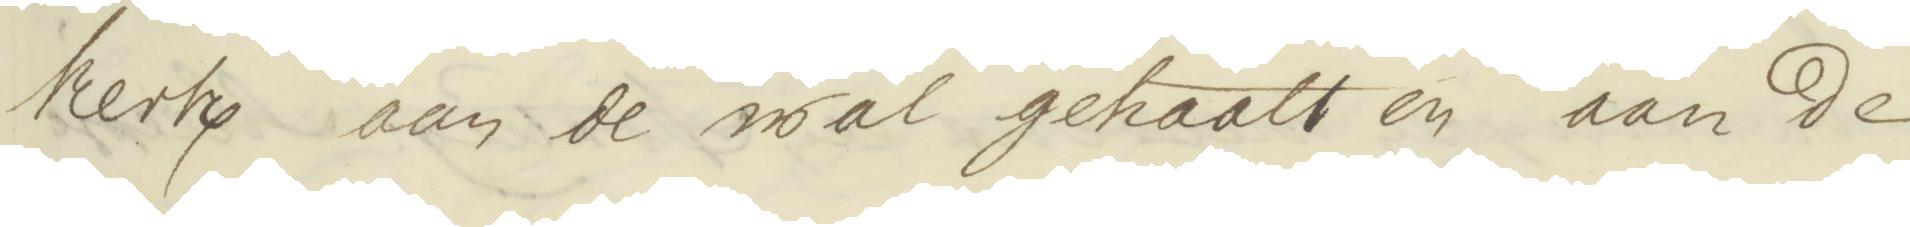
kerk aan de wal gehoolt en aan de
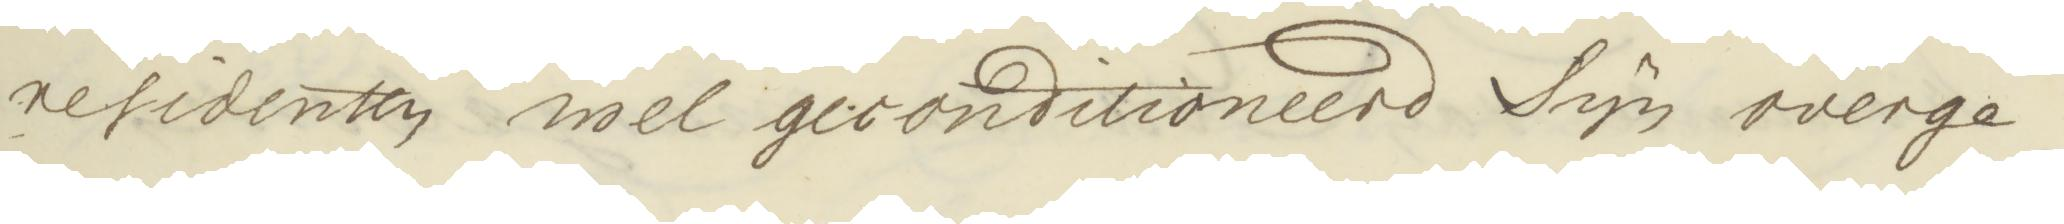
residenten wel geconditioneerd sijn overge„
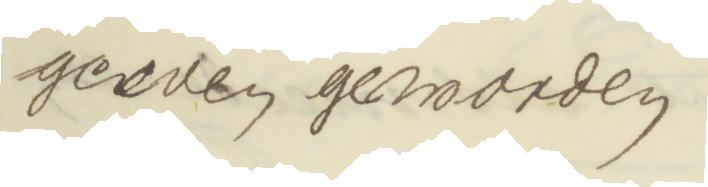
geeven geworden
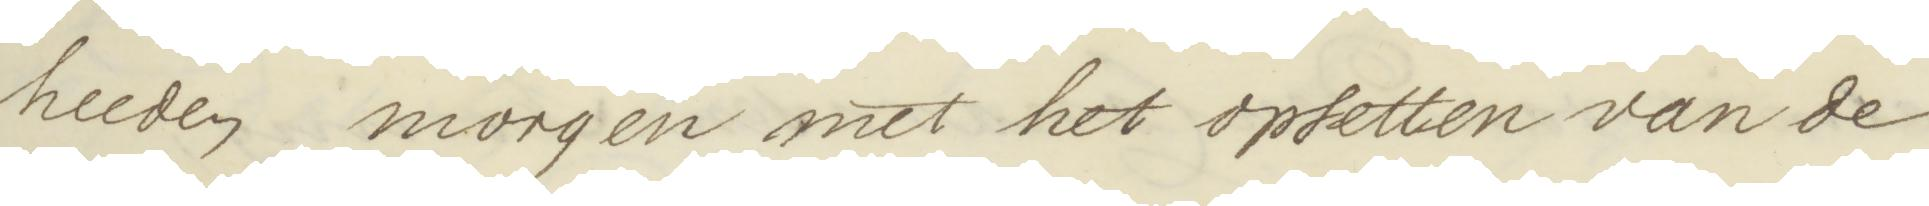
heeden morgen met het opsetten van de
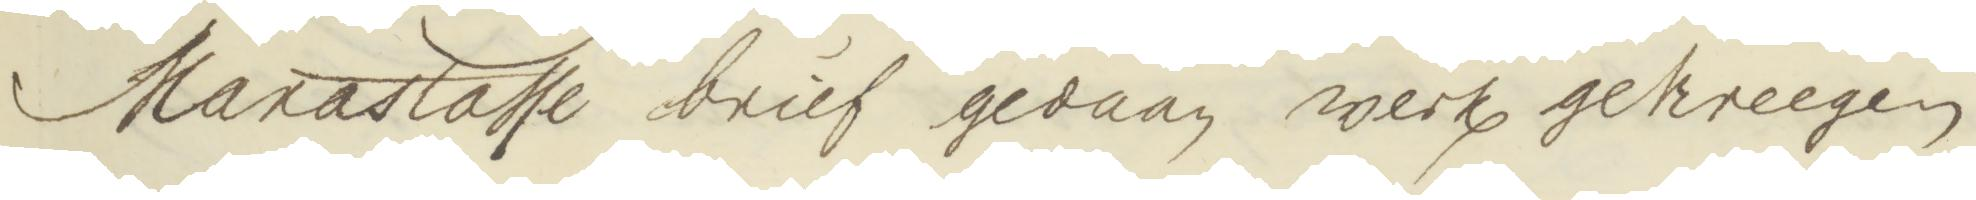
Marastasse brief gedaan werk gekreegen
